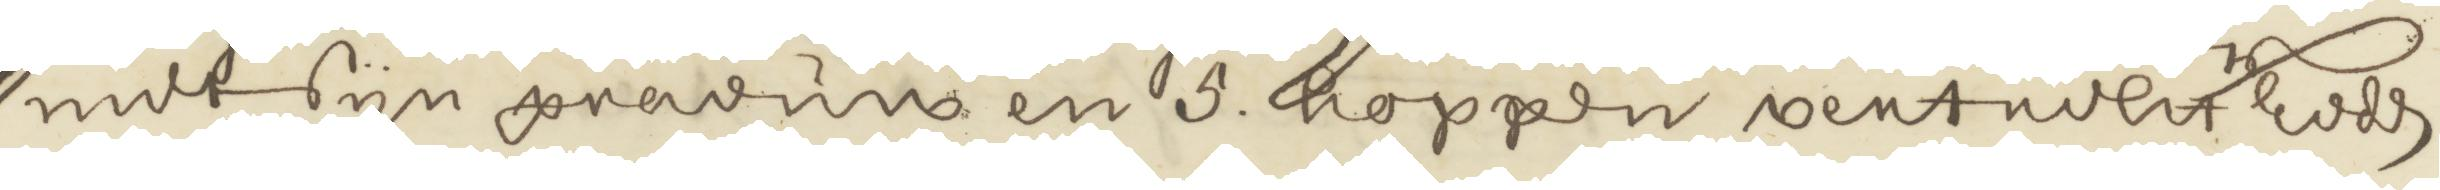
met sijn praeuw en 5. koppen vertrekt heden
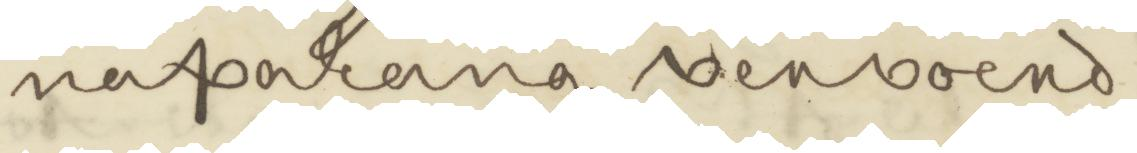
na pakang vervoerd.
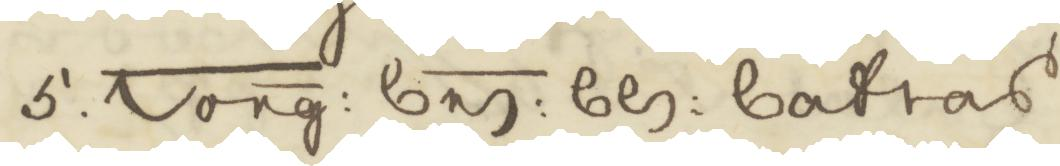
5: Corg: br: bl: baftas
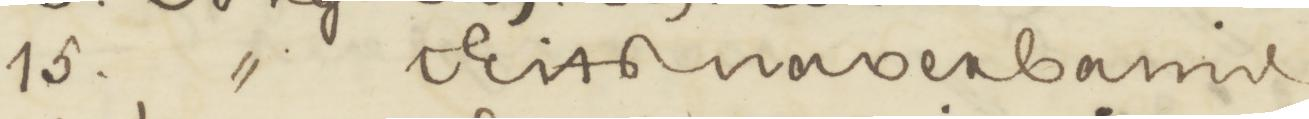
15. „ chits naverbanie
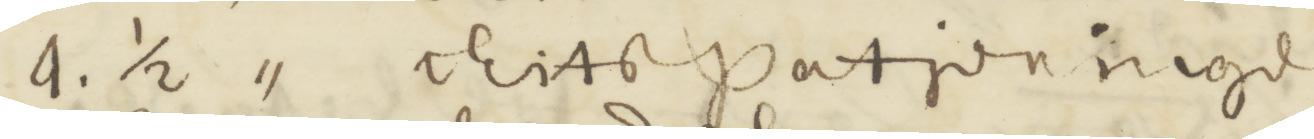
4.½ „ chits patjeringe
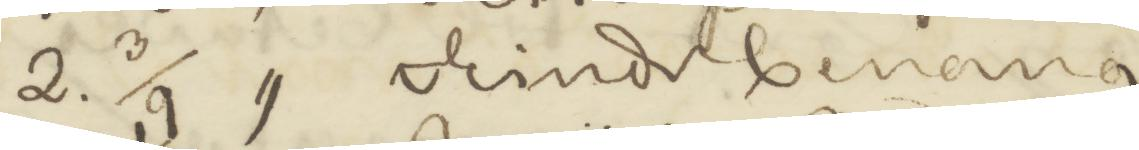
2. 3/9 „ chinde benang
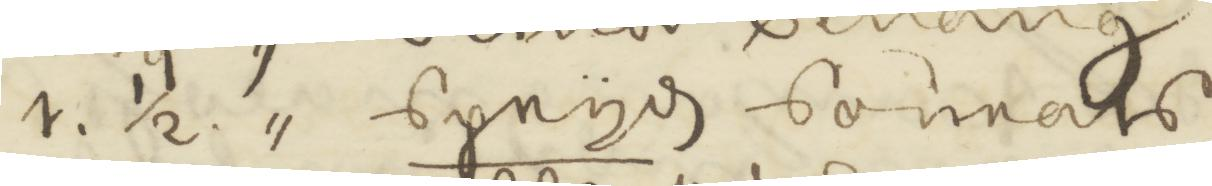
1.½. „ sprijen sourats
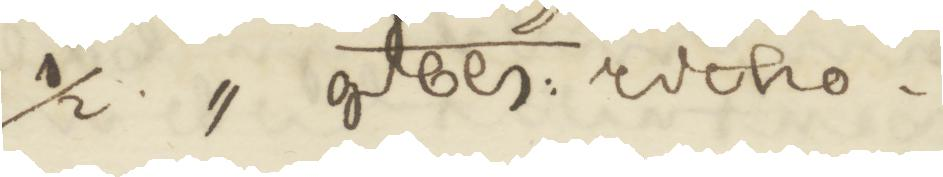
½. „ gebl: recko
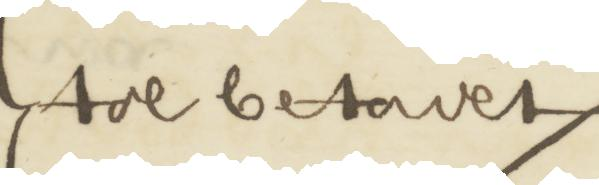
tol betaelt
